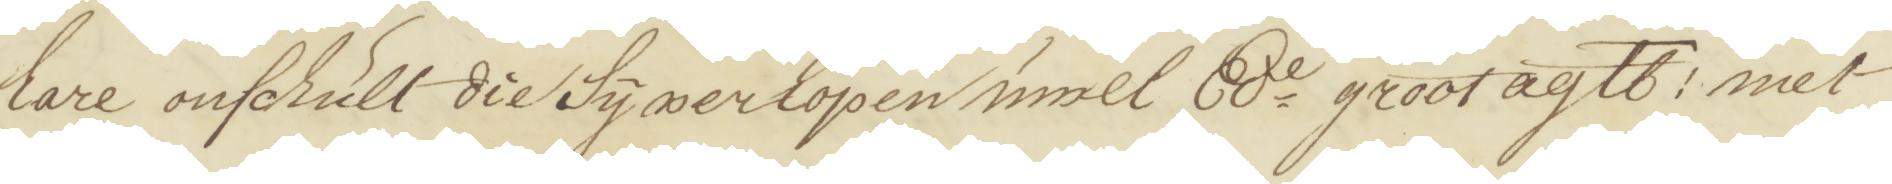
hare onschult die sij verhopen uwel Ed=e groot agtb: met
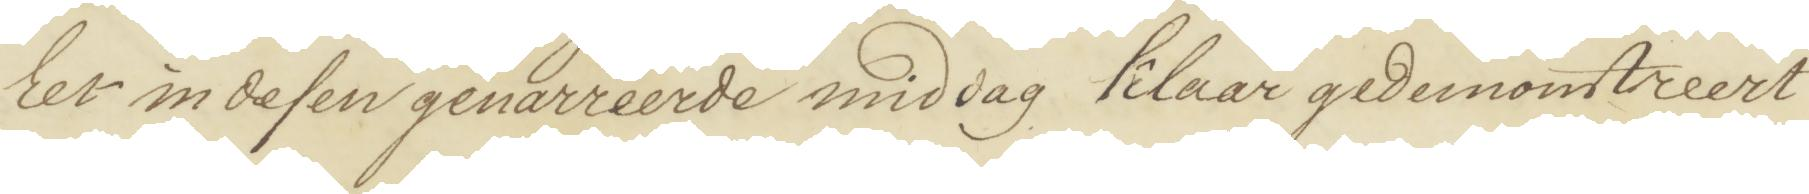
het in desen genarreerde middag klaar gedemonstreert
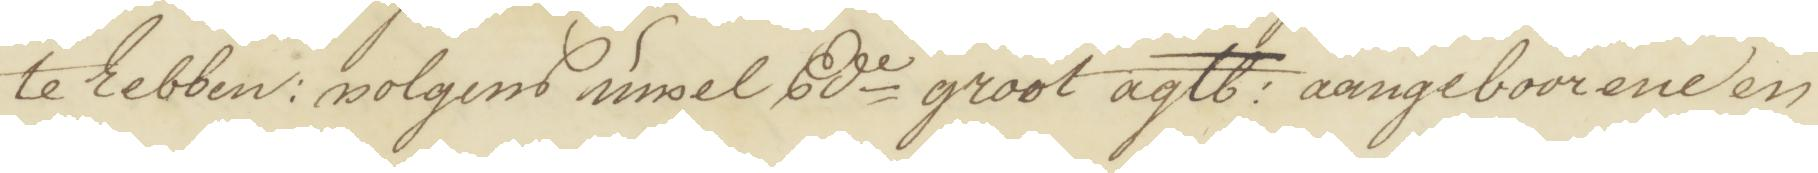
te hebben: volgens uwel Ed=e groot agtb: aangeboorene en
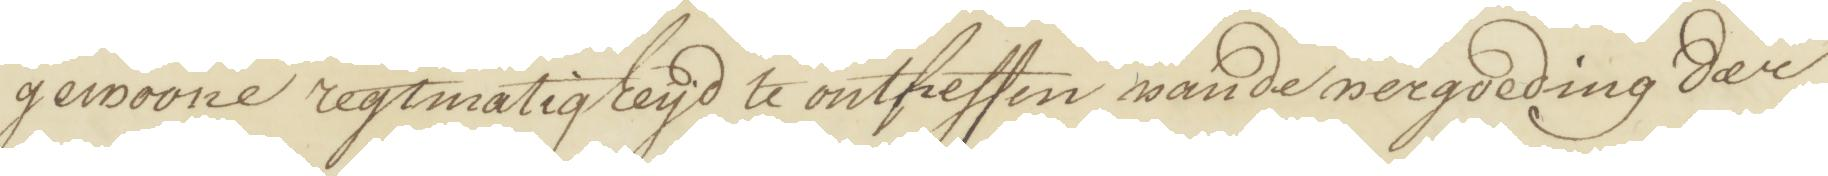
gewoone regtmatigheijd te ontheffen van de vergoeding der
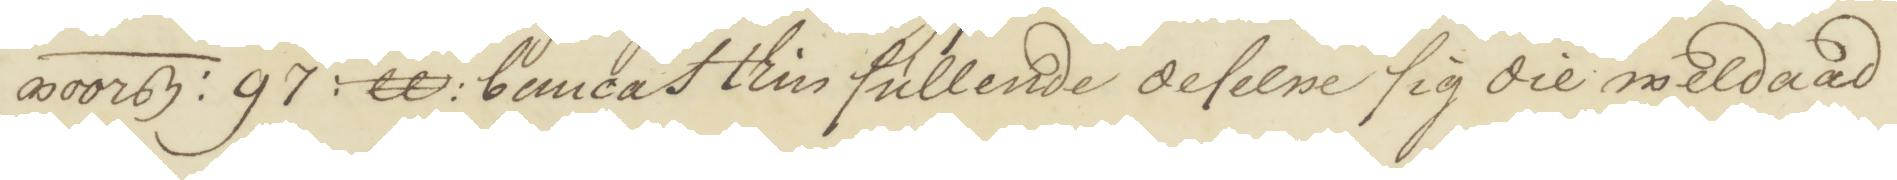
voorsz: 97: lb: bancasthin sullende deselve sig die weldaad
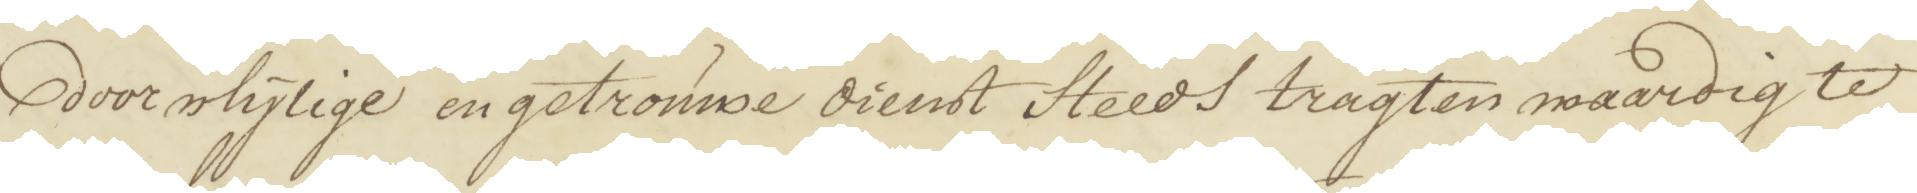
door vlijtige en getrouwe dienst steeds tragten waardig te
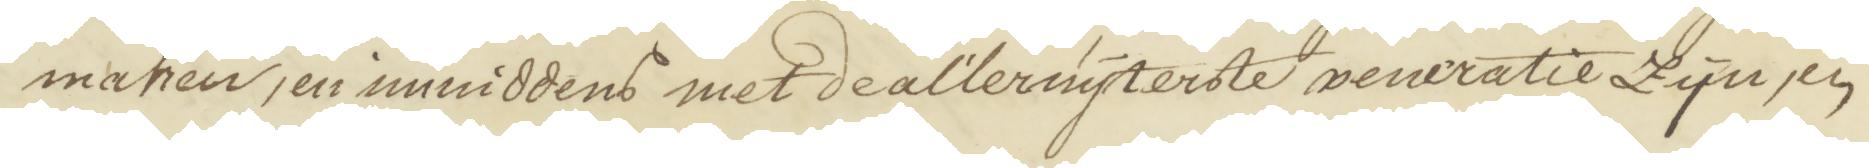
maken, en inmiddens met de al'leruijterste veneratie zijn, en
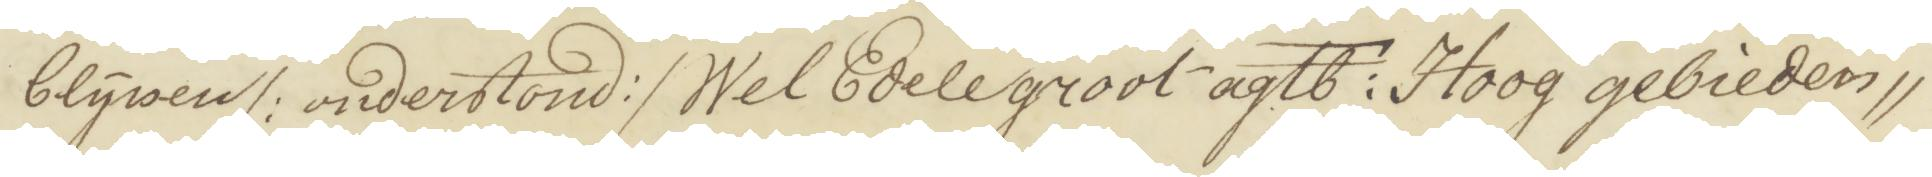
blijven /:onderstond:/ Wel Edele groot agtb: Hoog gebieden„
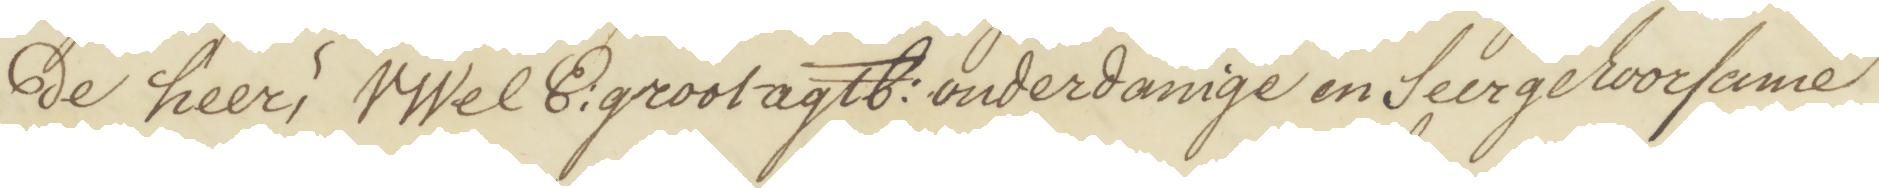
de heer, VWel E: groot agtb: onderdanige en seergehoorsame
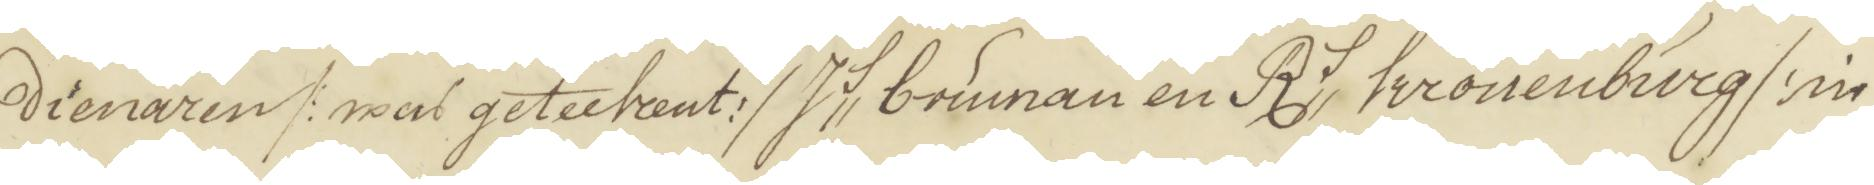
dienaren /:was geteekent:/ J„s bouman en R„s kronenburg /:in
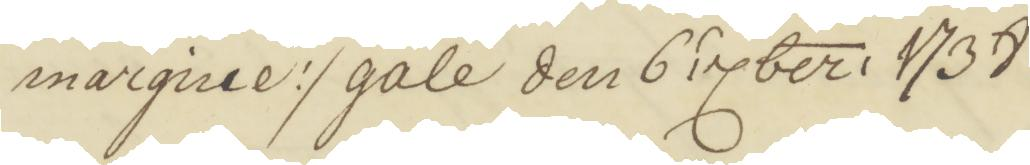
margine:/ gale den 6, xber, 1738
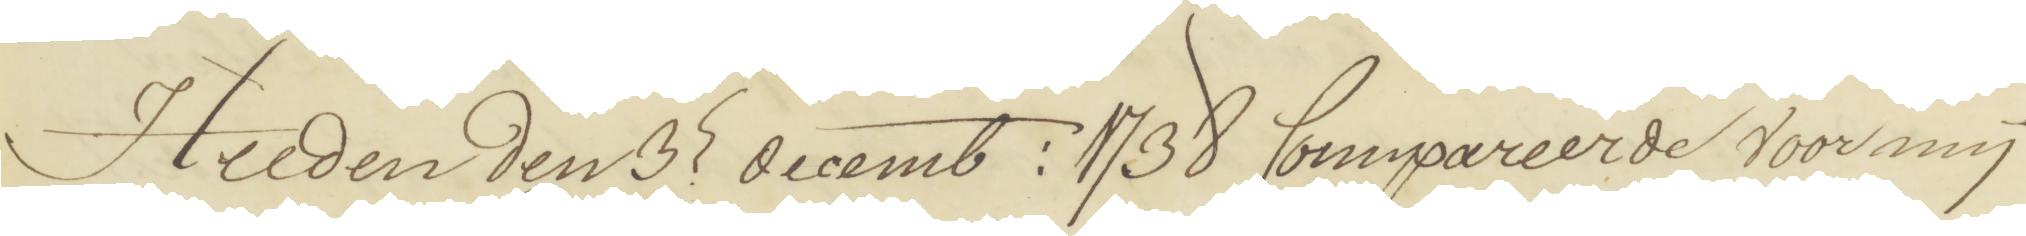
Heeden den 3: decemb:r 1738 Compareerde Voor mij
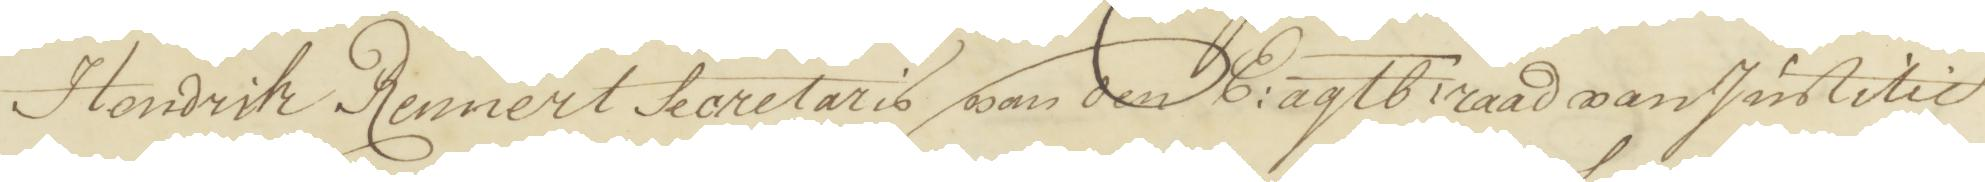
Hendrik Rennert secretaris van den E: agtb: raad van Justitie
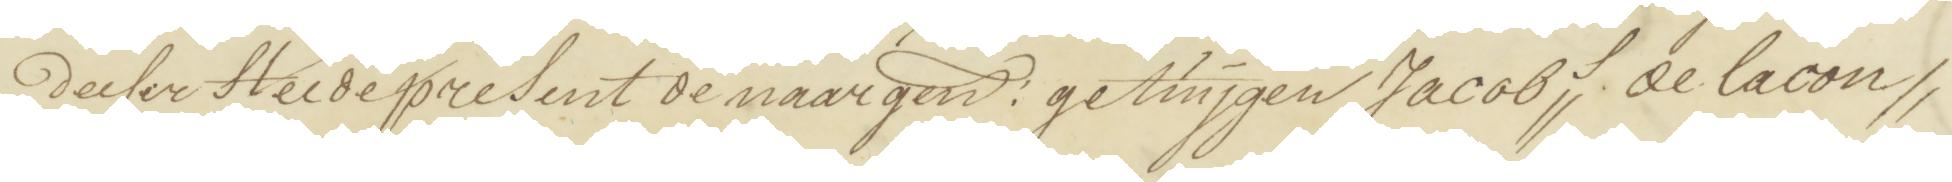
deeser steede present de naar gen: getuijgen Jacob„s de lacon„
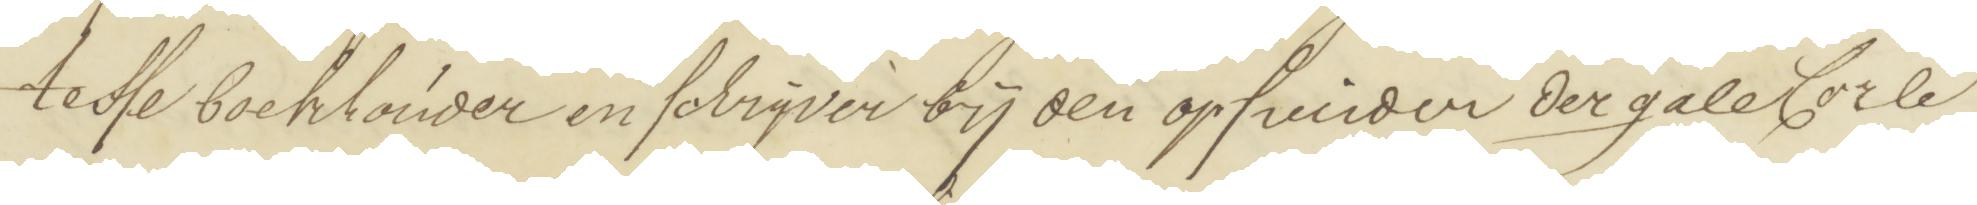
tesse boekhouder en schrijver bij den opsiender der galecorle
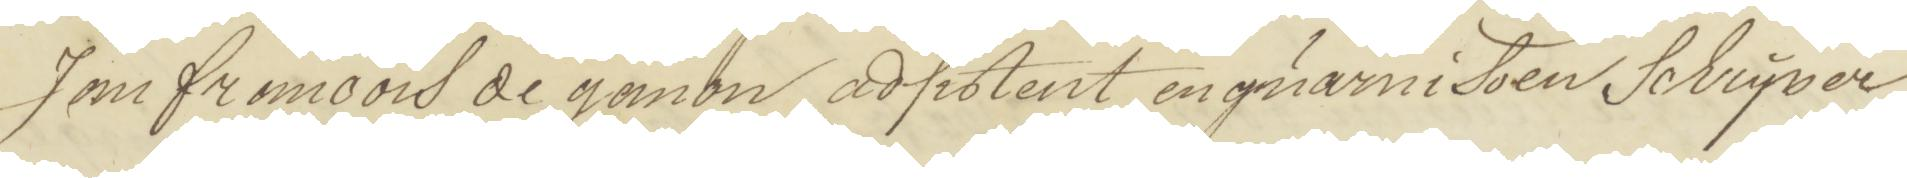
Jan fromoois de ganon adsistent en guarnisoen schrijver
